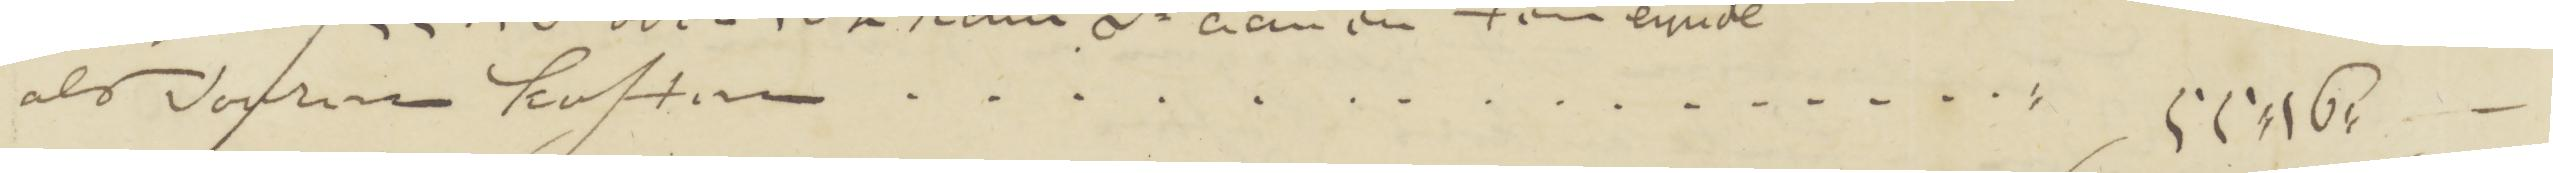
als vooren kosten . . . . . . - . . . - - - - - .„ 55„16„ —
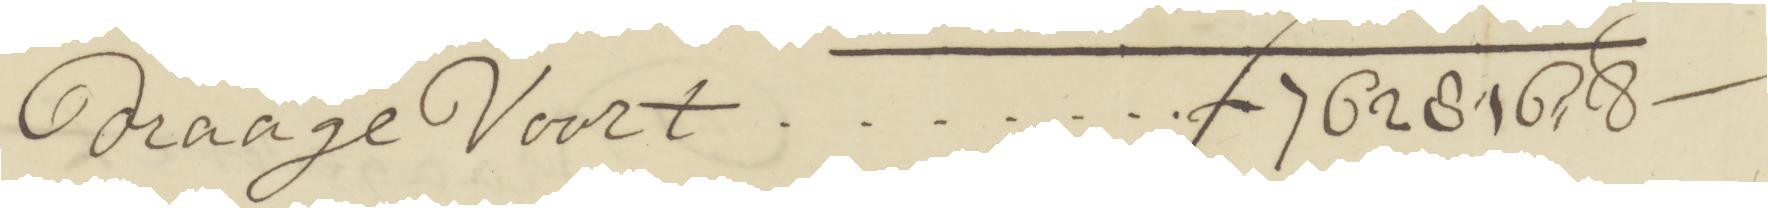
draage Voort . . . . . . . . ƒ762816„8—
